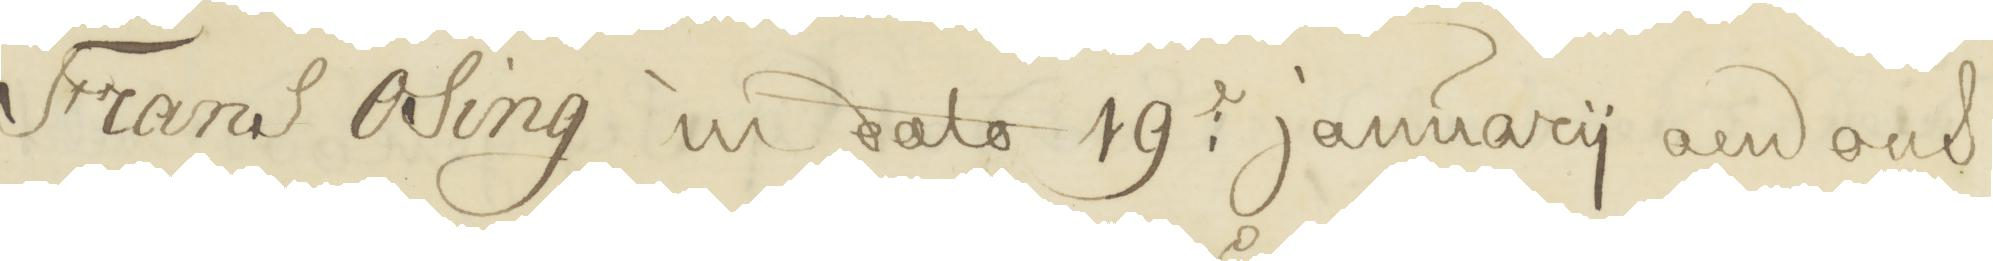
Frans Osing in dato 19:e januarij aen ons
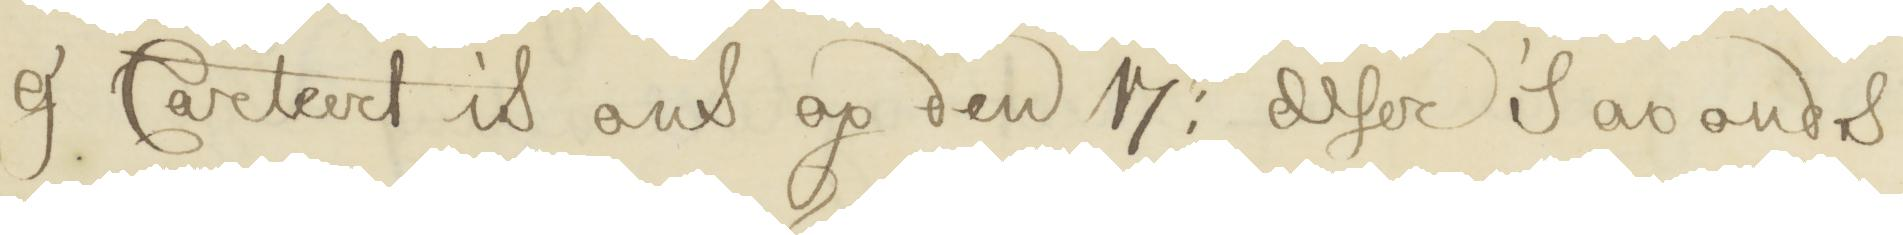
g' carteert is ons op den 17:e deser 's avonds
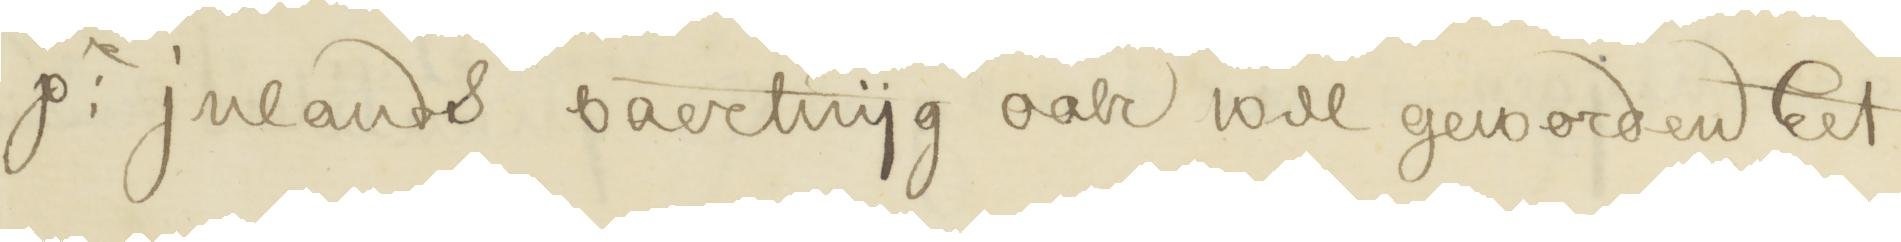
p:r jnlands vaertuijg ook wel geworden het
